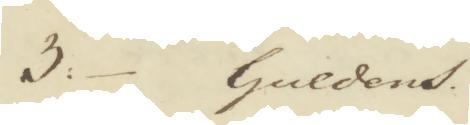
3:— Guldens.
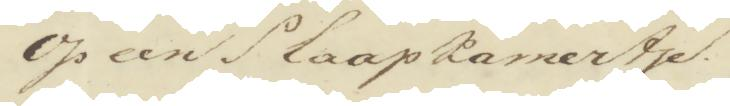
Op een slaapkamertje.
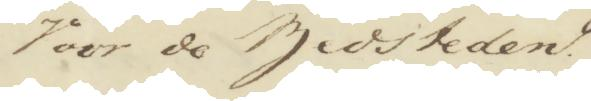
Voor de Bedsteden.
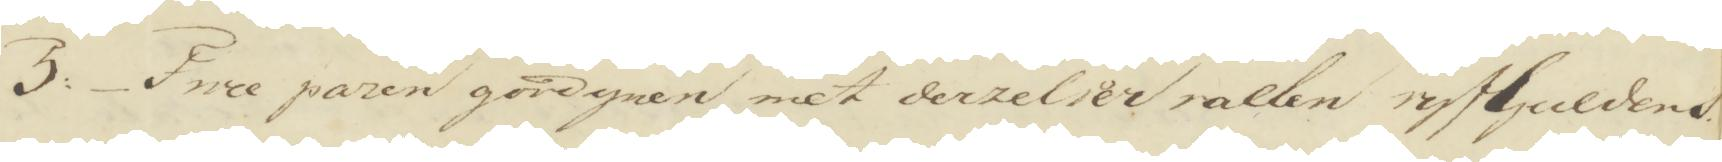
5: — Twee paren gordynen met derzelver vallen vyf Guldens.
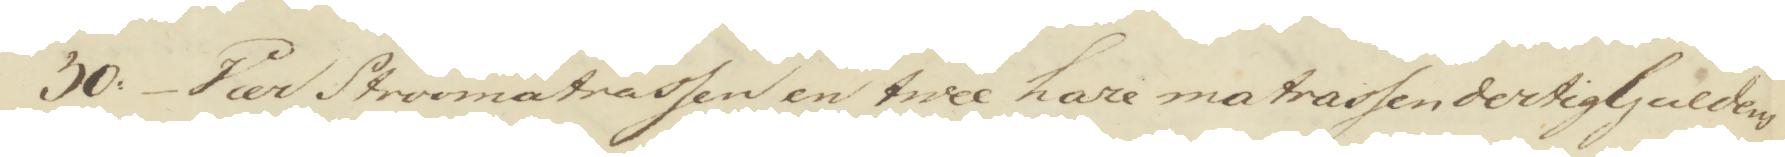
30: — Vier Stroomatrassen en twee hare matrassen, dertig Guldens
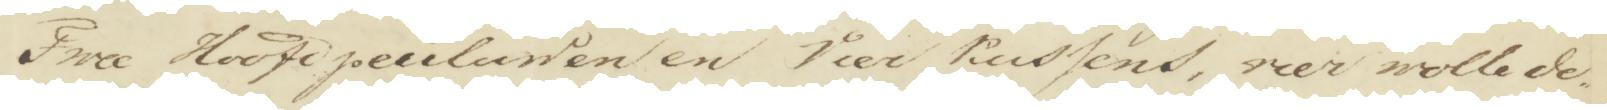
Twee Hoofdpeuluwen en Vier kussens, vier wolle de„
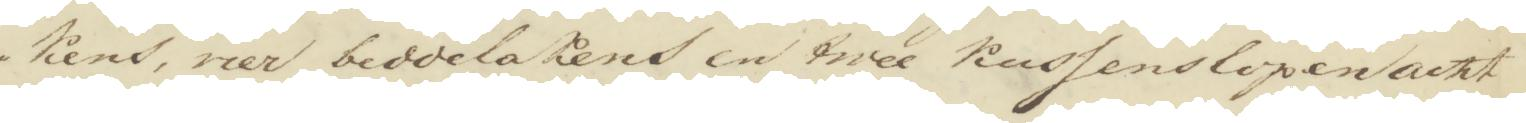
kens, vier beddelakens en twee kussenslopen acht
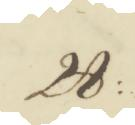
28:
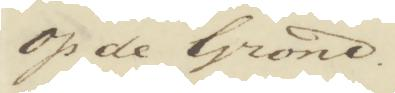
op de Grond.
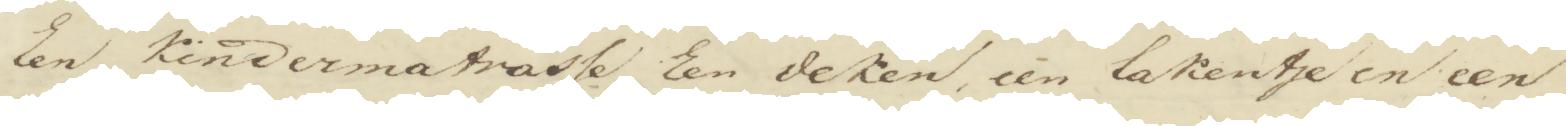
Een kindermatrasse, Een deken, een lakentje en een
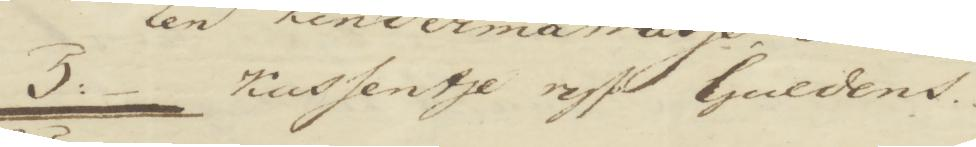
5: — kussentje vyf Guldens.
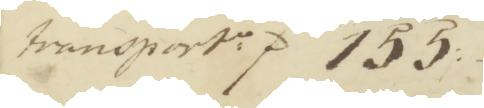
Transport: ƒ 155:
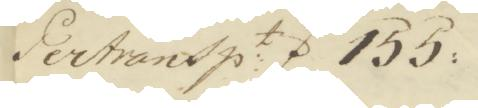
Pertransp:t ƒ 155:
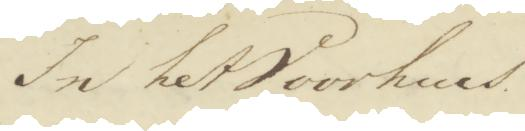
In het Voorhuis.
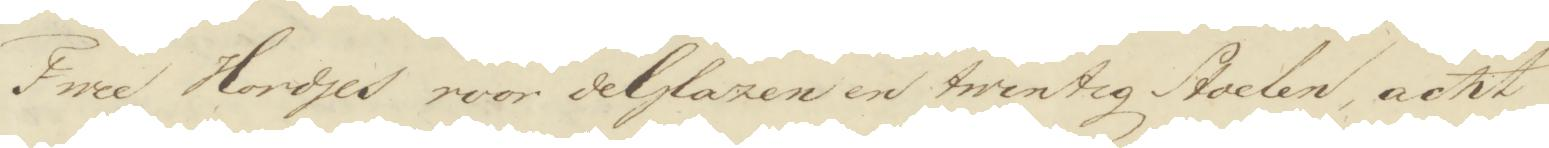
Twee Hordjes voor de Glazen en twintig stoelen, acht
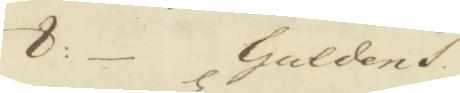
8:— Guldens.
